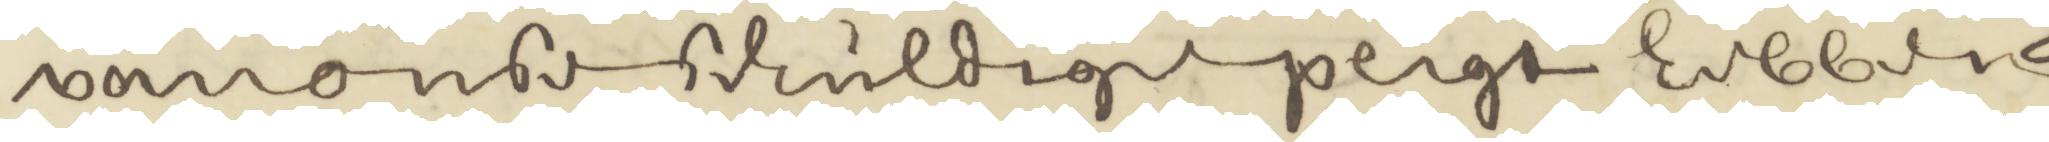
van onse schuldige pligt hebben
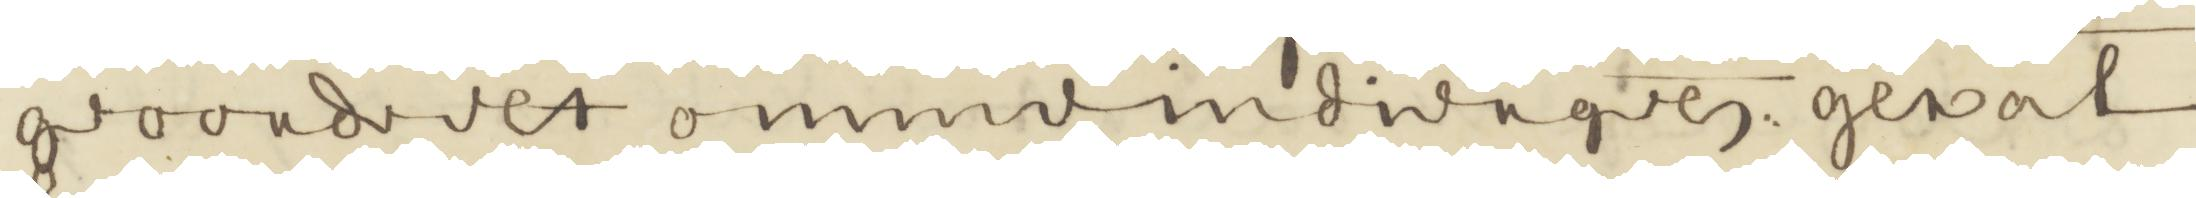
geoordeelt omme in diergelijk geval
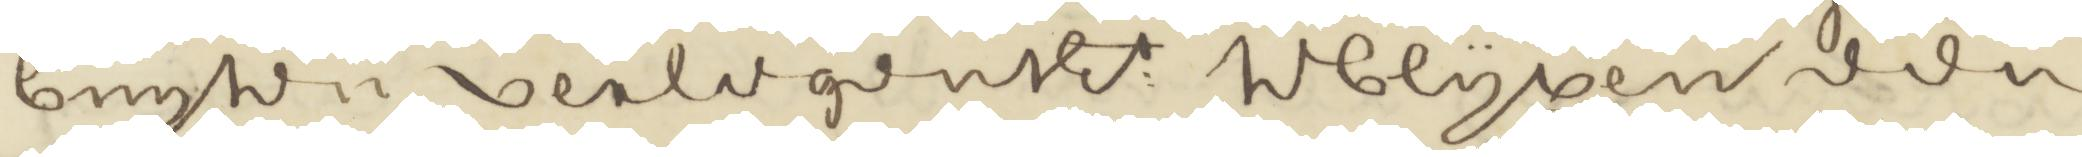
buyten verlegenth:t te blijven een
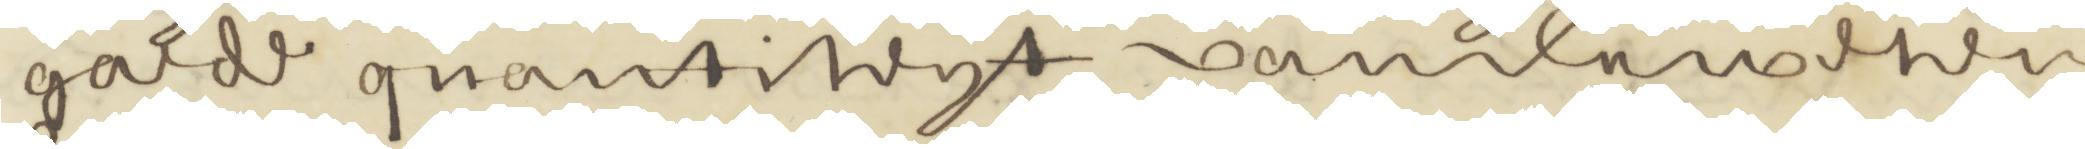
goede quantiteijt van Erweten
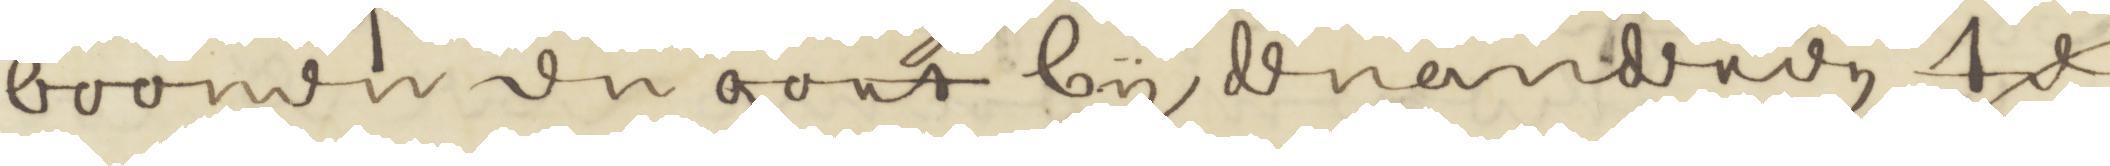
boonen en gort bij denanderen te
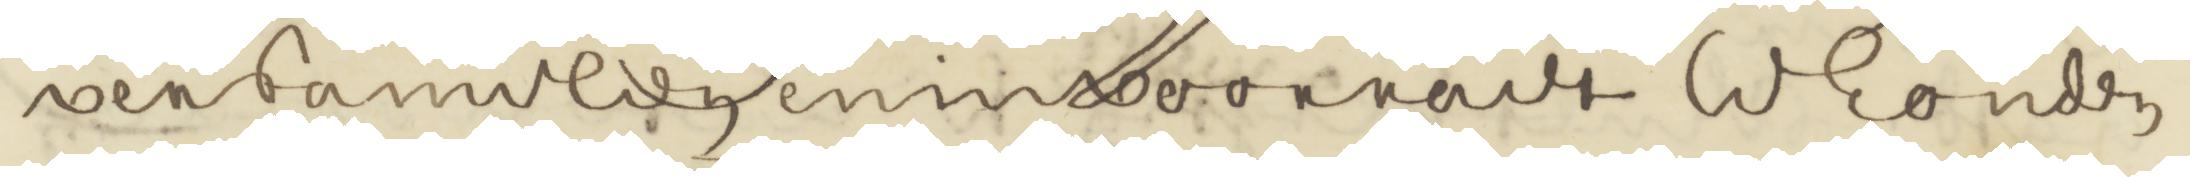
versamelen en in voorraet te houden
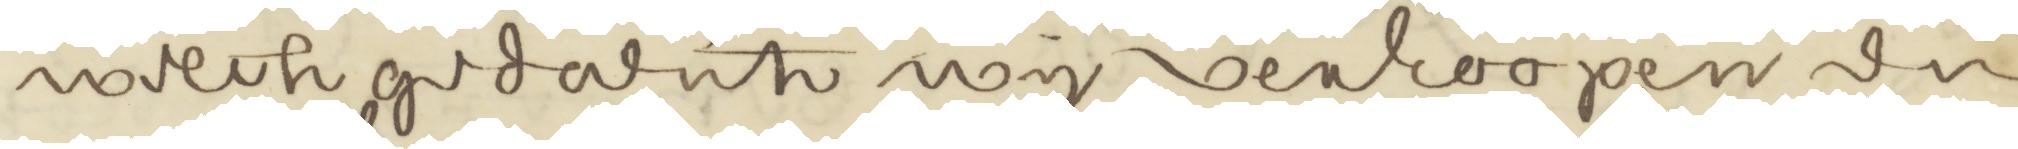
welck gedoente wij verhoopen en
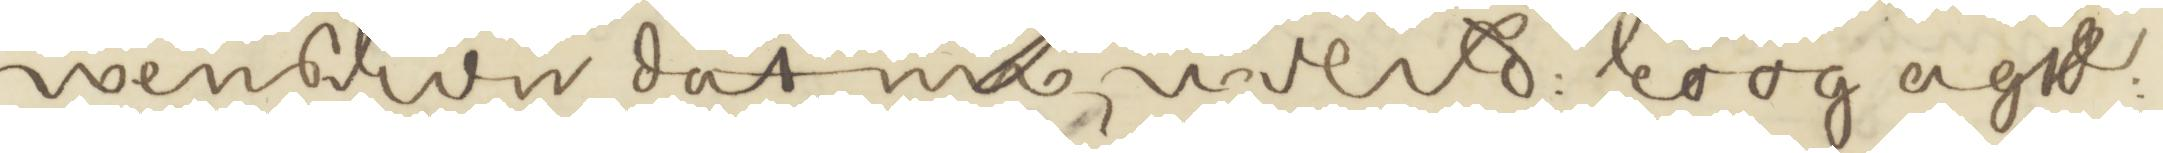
wenschen dat uw wel Ed: hoog agtb:
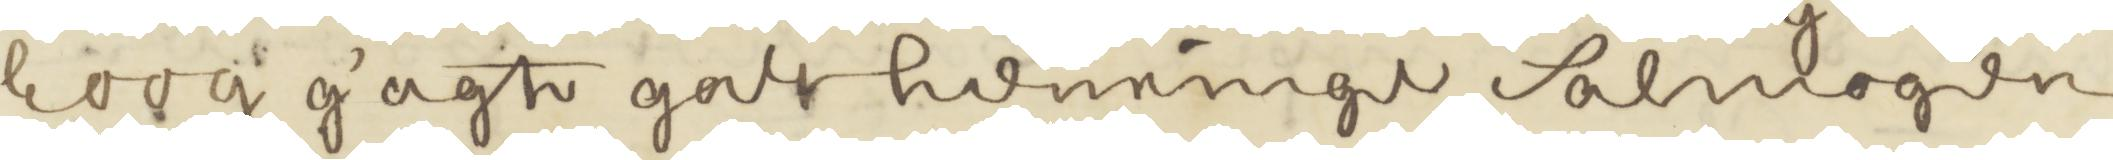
hoog g’agte goetkeuringe salmogen
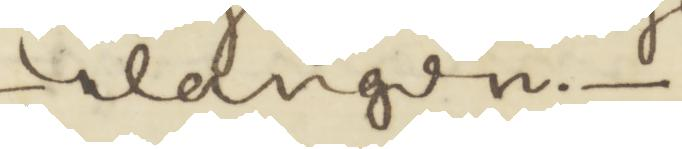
erlangen. —
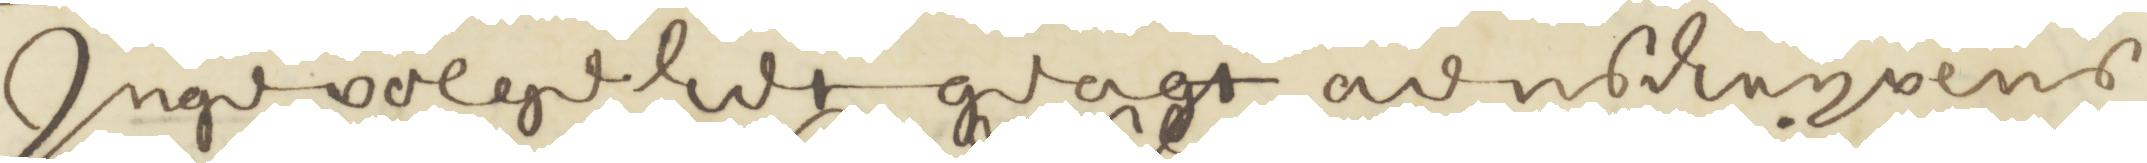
Jngevolge het geagt aenschrijvens
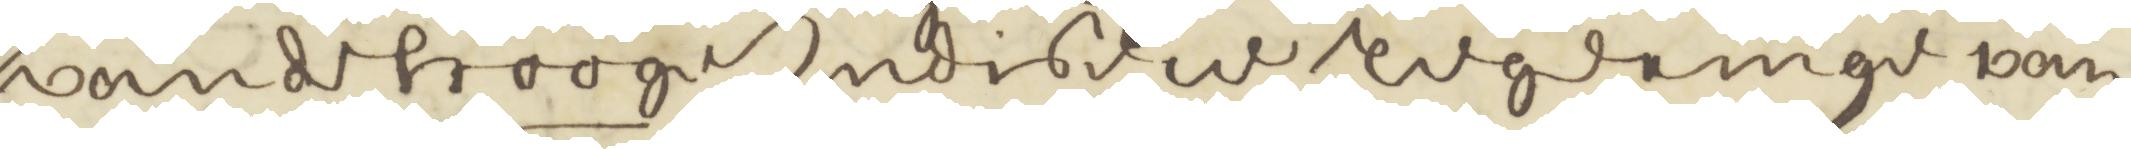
van de hooge Jndische regeringe van
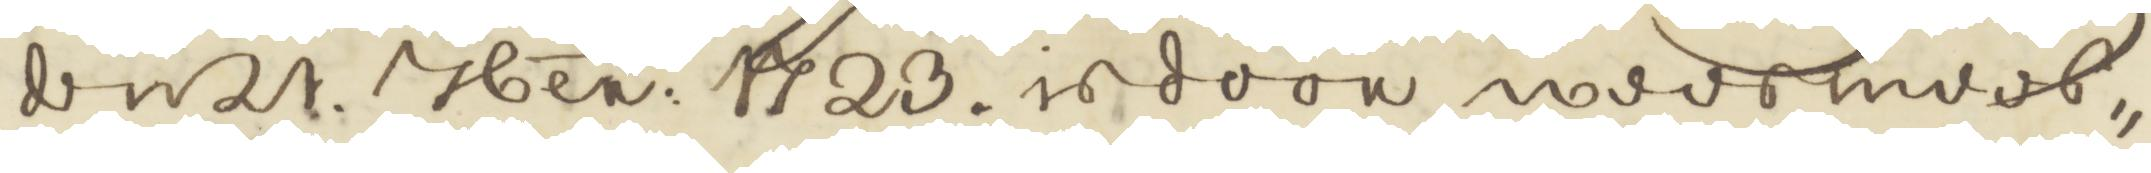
den 21. 7ber: 1723. is door weesmees„
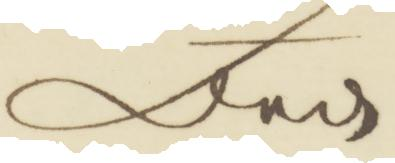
teren
